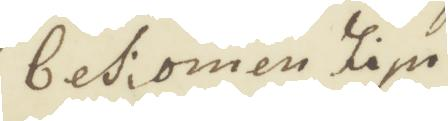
bekomen zijn
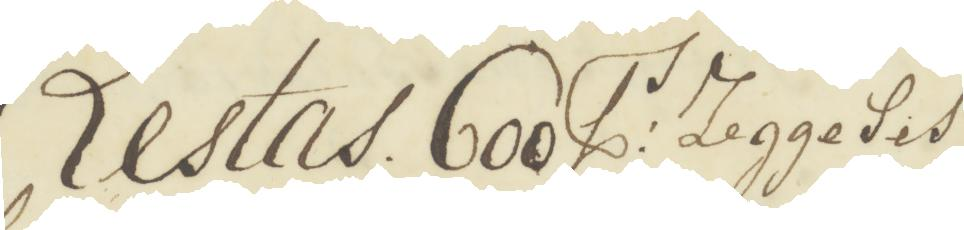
Restas, 600p:s zegge ses
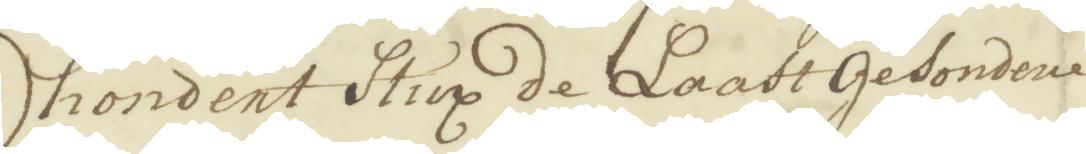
hondert stux de Laast gesonden
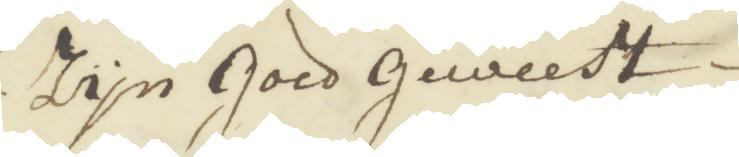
zijn goed geweest
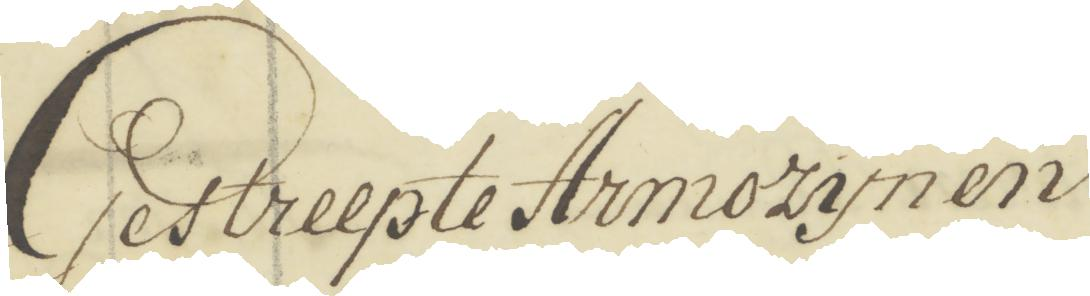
Gestreepte Armozijnen
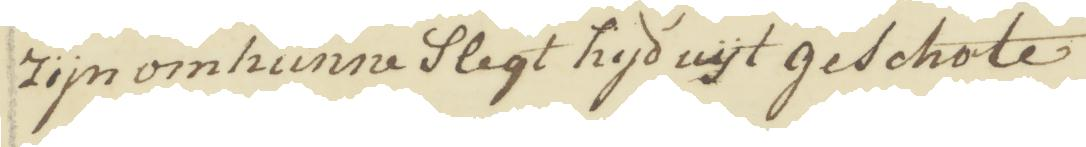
zijn om hunne slegt hyd uijt geschote
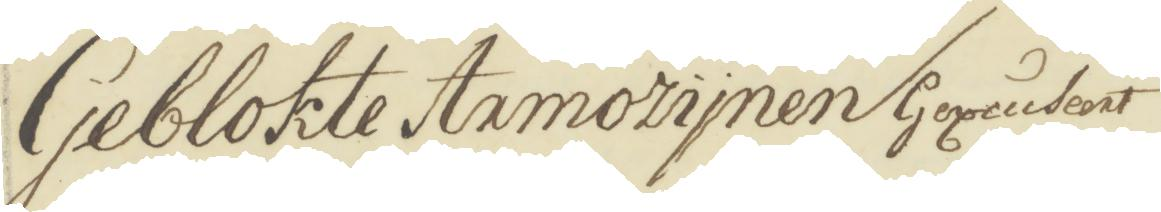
Geblokte Armozijnen Gexcuseert
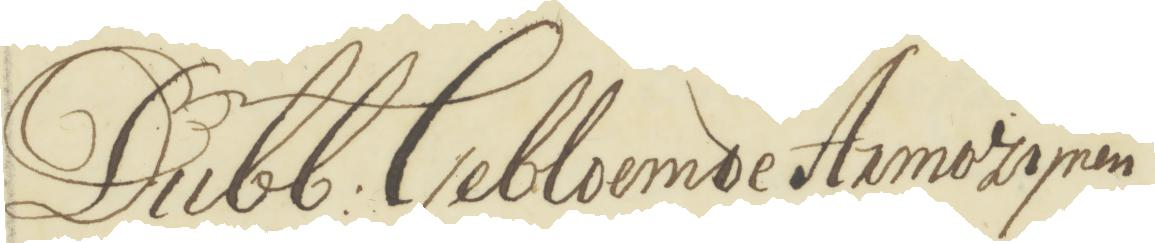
Dubb: Gebloemde Armozijnen
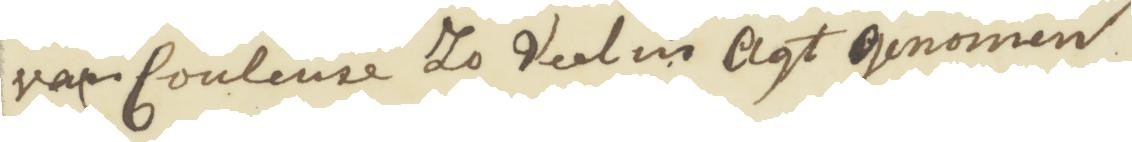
van Couleure zo veel in Agt genomen
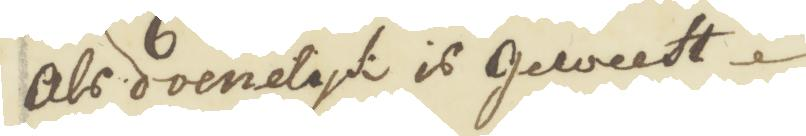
als doenelyk is geweest
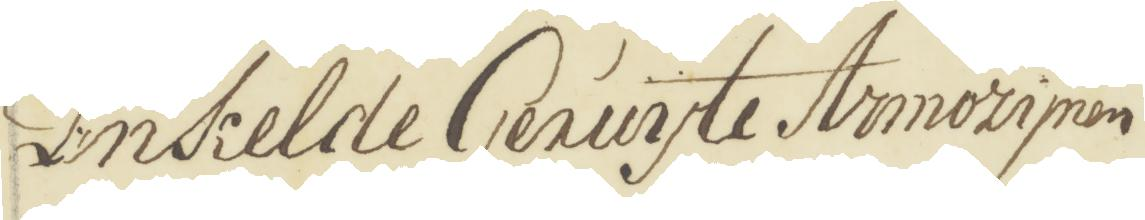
Enkelde Geruijte Armozijnen
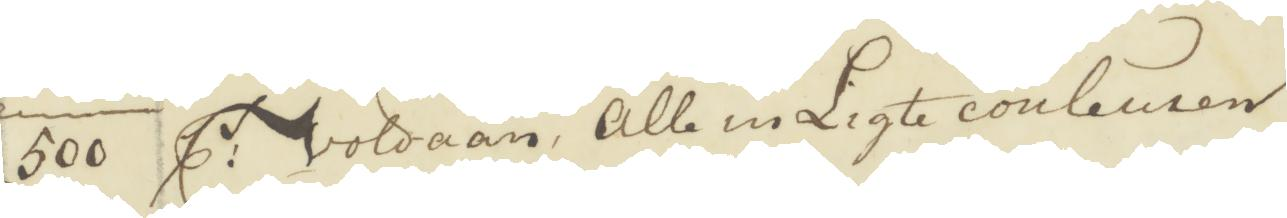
500 p:s voldaan, alle in Ligte couleuren
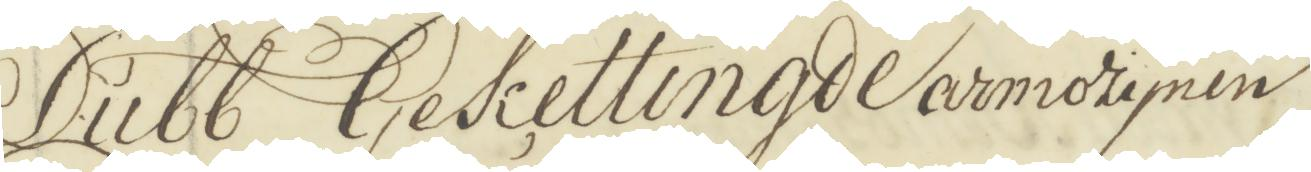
Dubb Gekettingde armozijnen
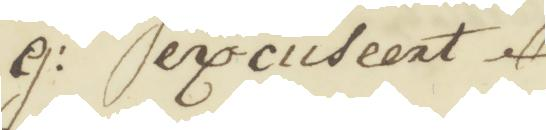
g: excuseert
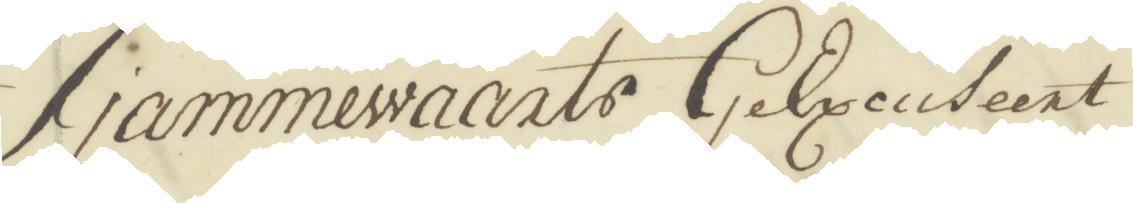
Sjammewaarts GeExcuseert
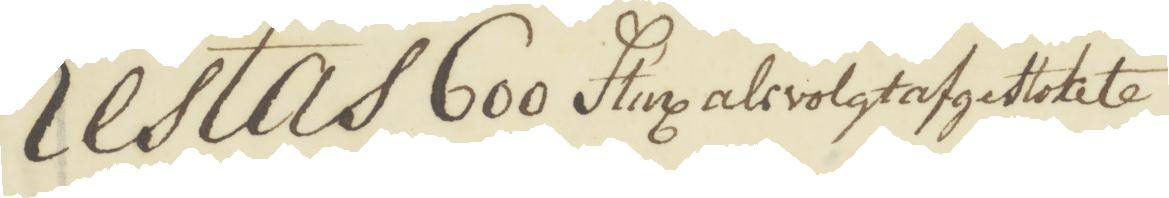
Restas 600 stux als volgt afgestokete
